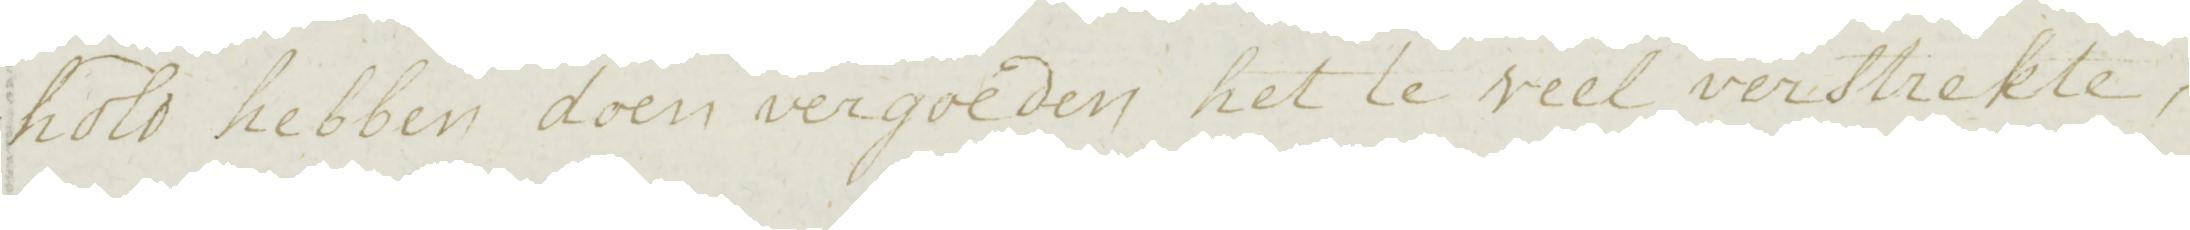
hold hebben doen vergoeden het te veel verstrekte,
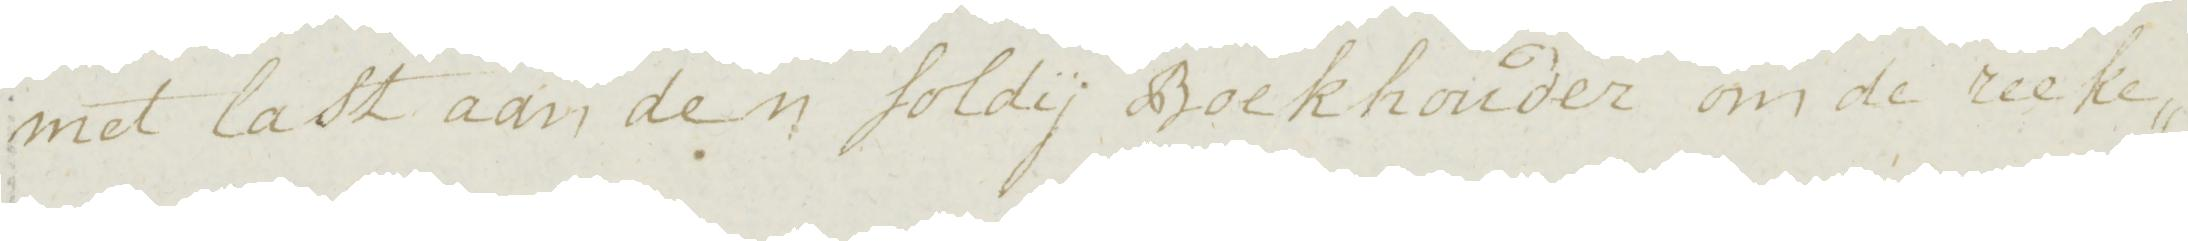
met last aan den soldij Boekhouder om de reeke„
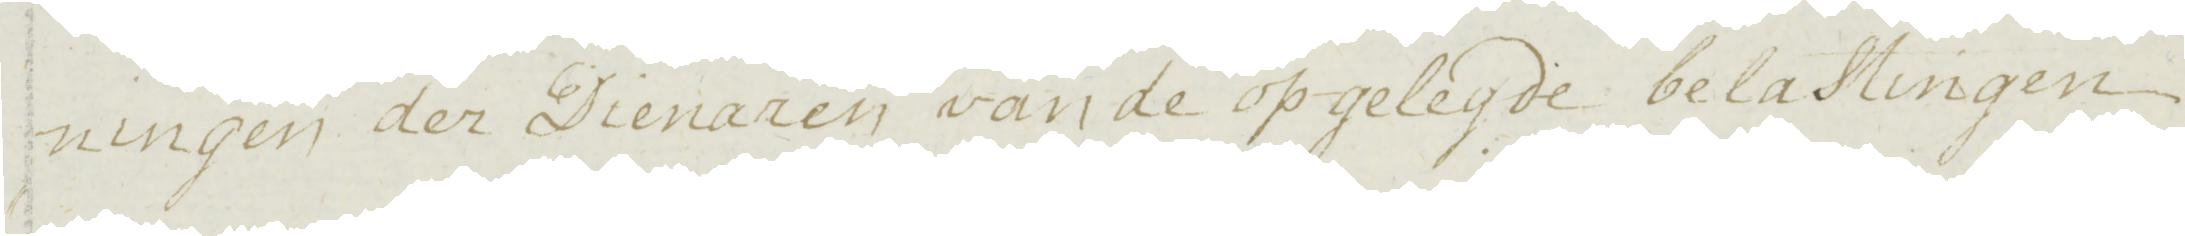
„ningen der Dienaren van de opgelegde belastingen
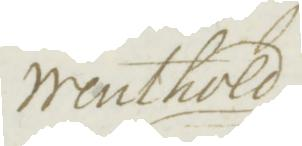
wenthold
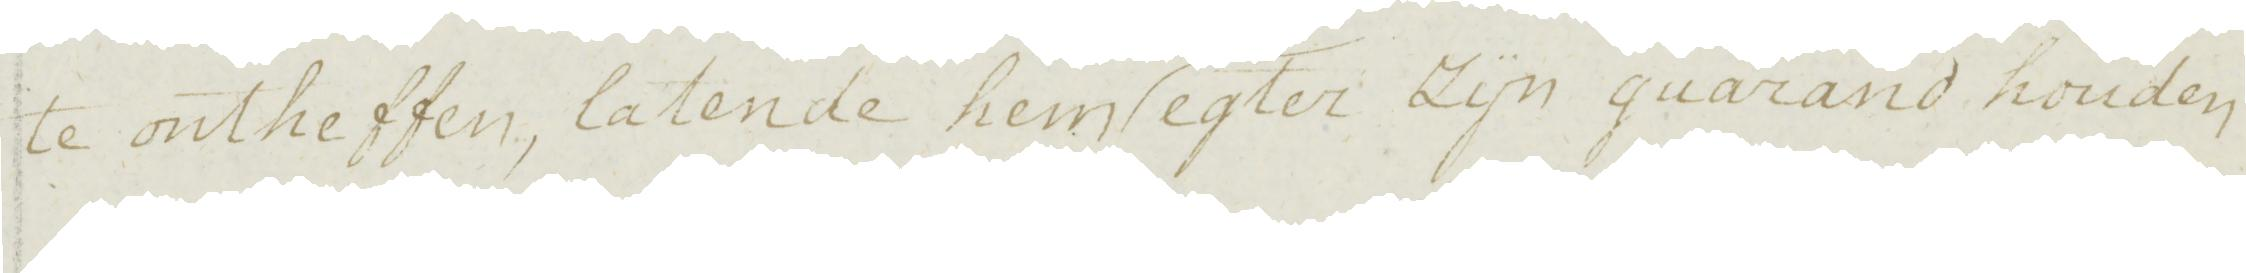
te ontheffen, latende hem egter zijn guarand houden
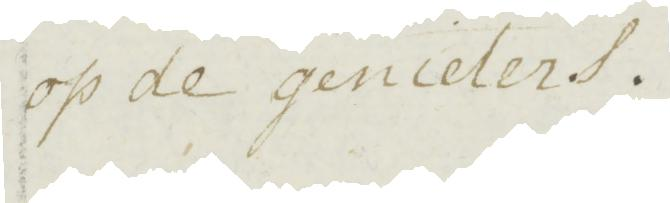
op de genieters.
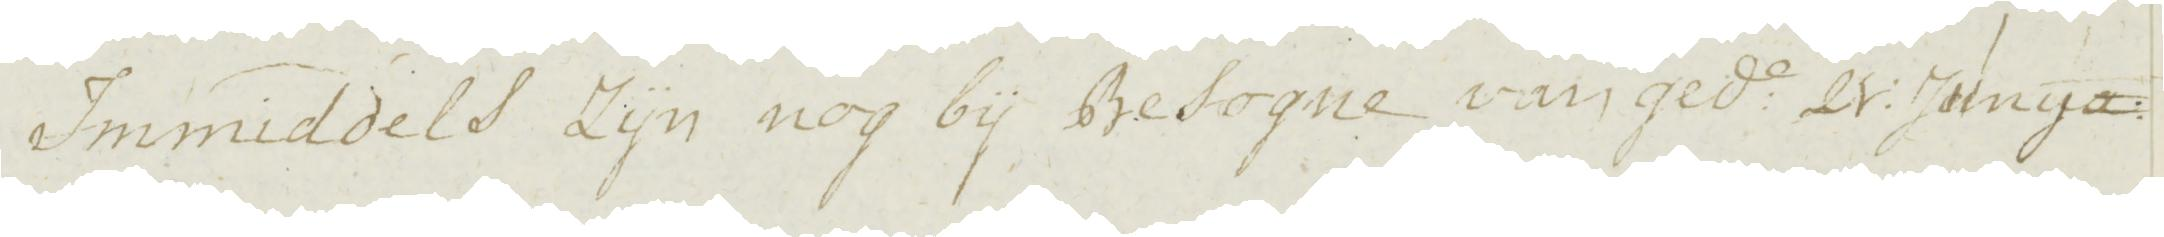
Immiddels zijn nog bij Besogne van ged:e 21: Junija:
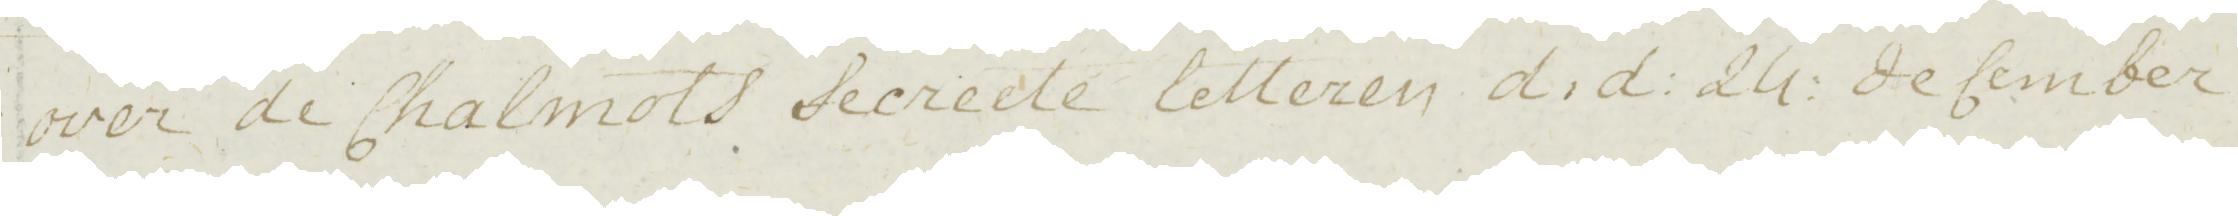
over de Chalmots secreete letteren d. d: 24: december
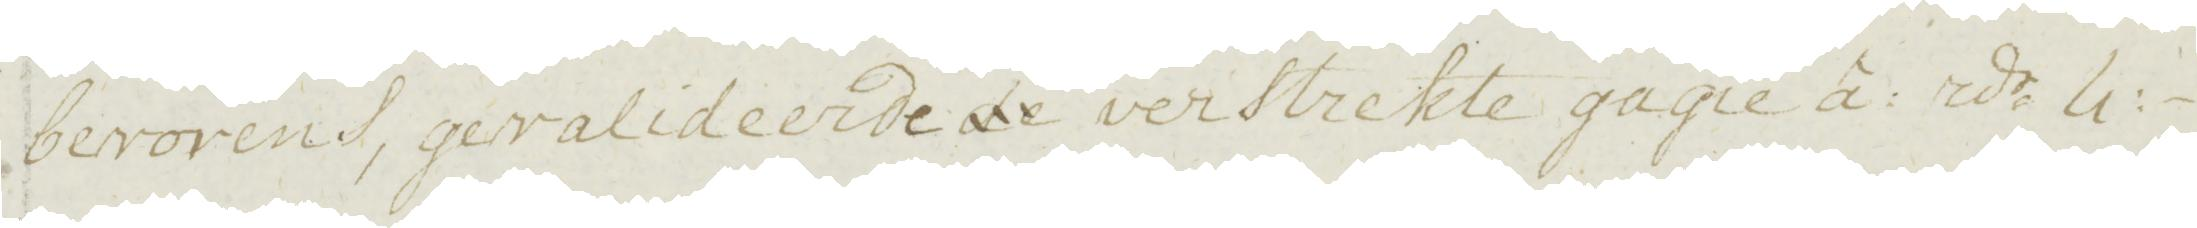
bevorens, gevalideerde te verstrekte gagie â: rd„s 4: –
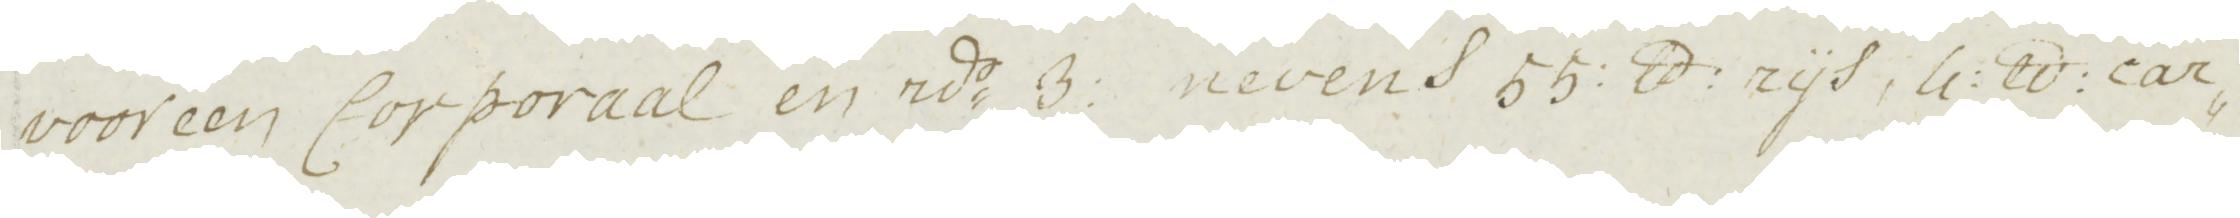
voor een Corporaal en rd„s 3: nevens 55: lb: rijs, 4: lb: car„
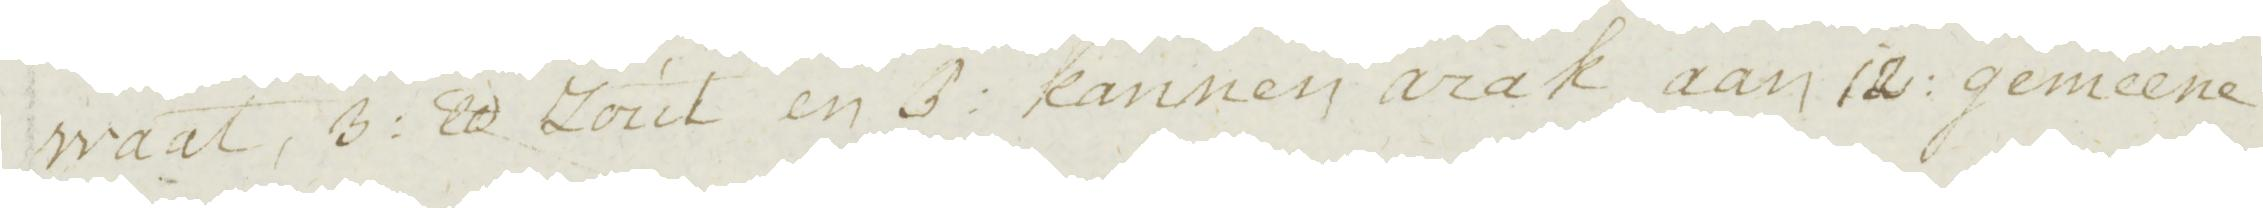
waat, 3: lb zout en 3: kannen arak aan .12: gemeene
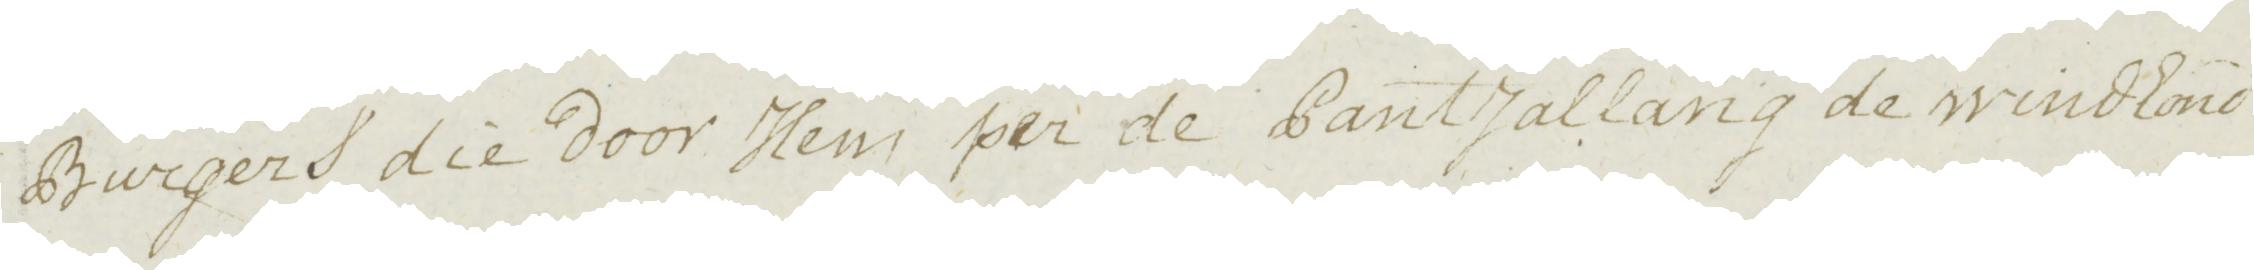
Burgers die door Hem per de Pantjallang de windhond
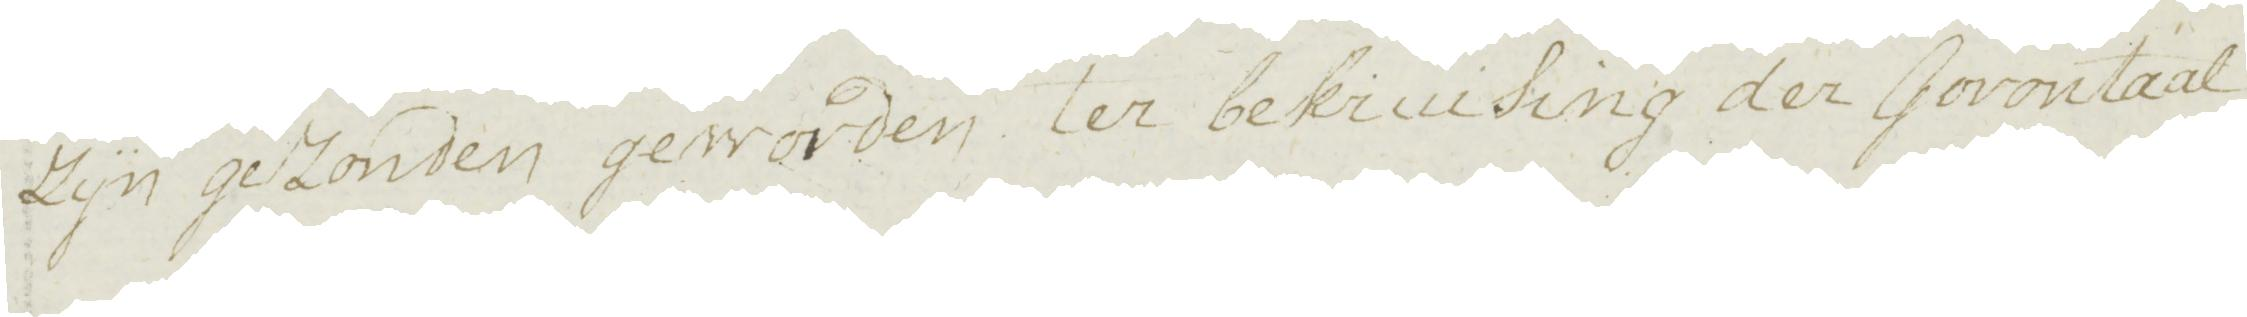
zijn gezonden geworden ter bekruising der Gorontaal
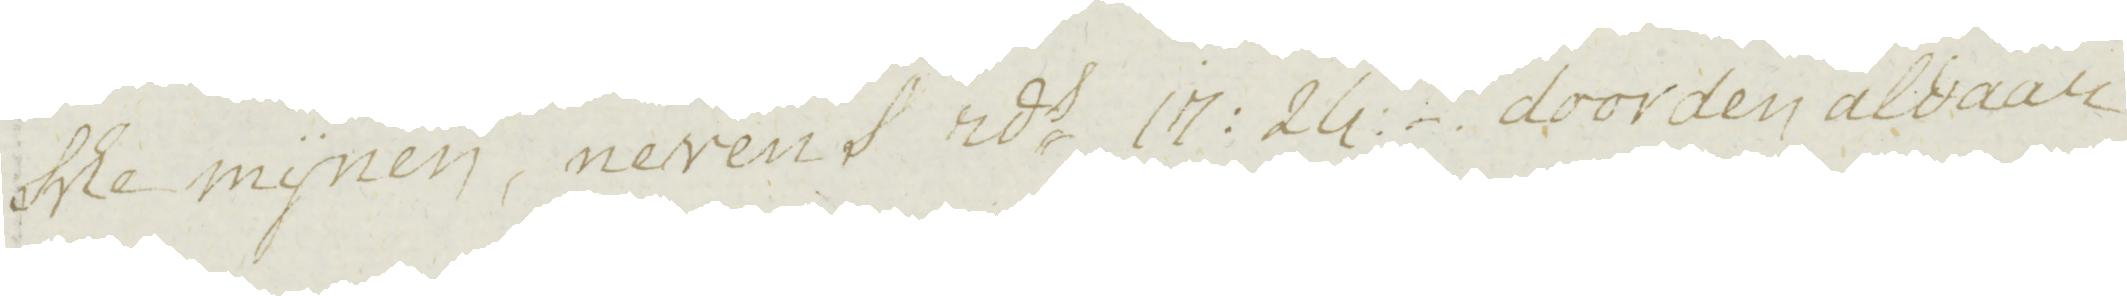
sche mijnen, nevens rd„s 17: 24: – . door den aldaar
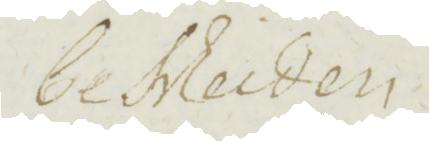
bescheiden
